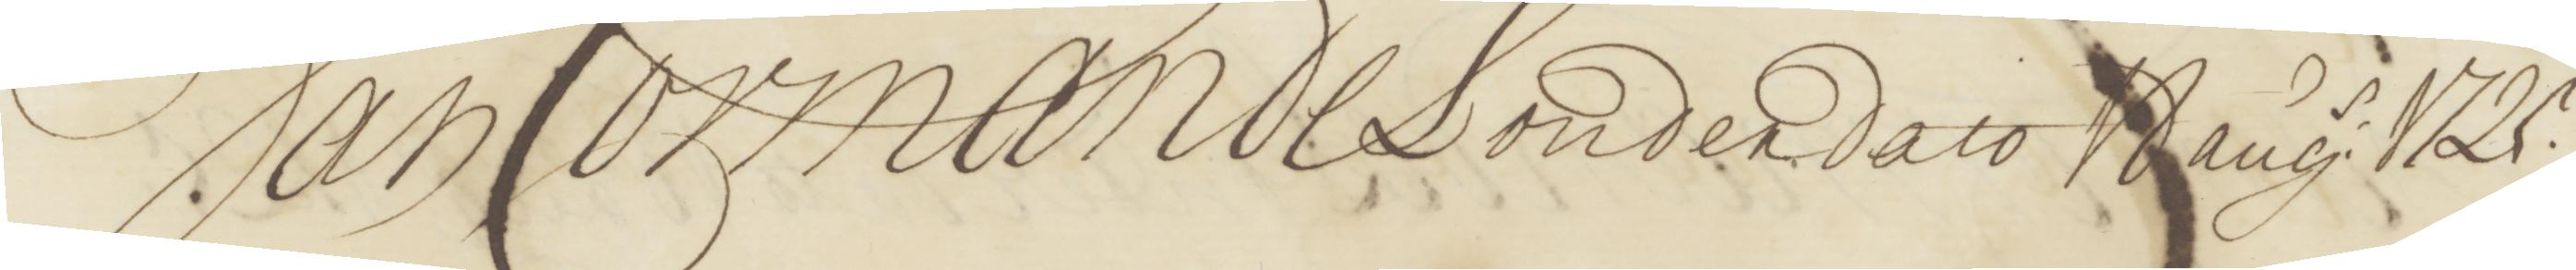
Van Cormandel onder dato 18 aug:s 1725.
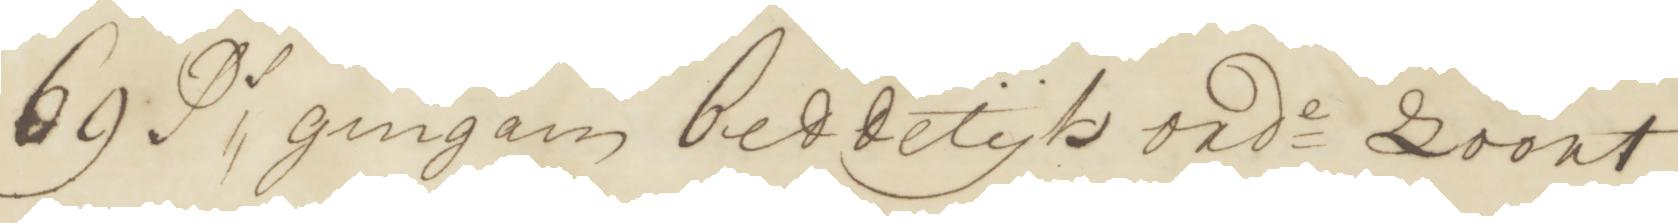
69 P„s gingam beddelijk ord=e zoort
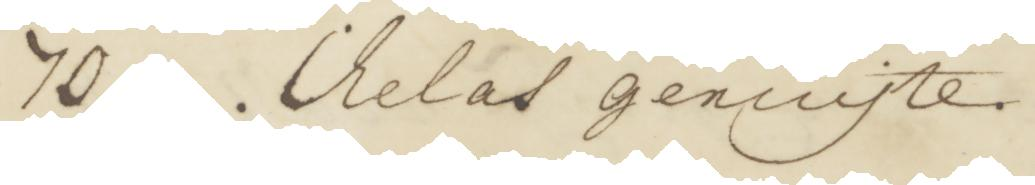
70. „ . Chelas geruijte.
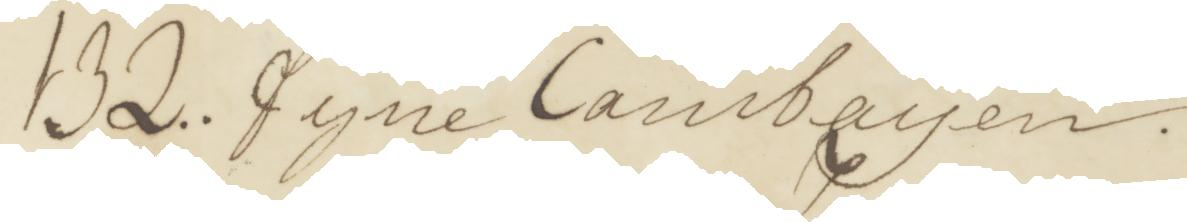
132.. fijne Cambaijen
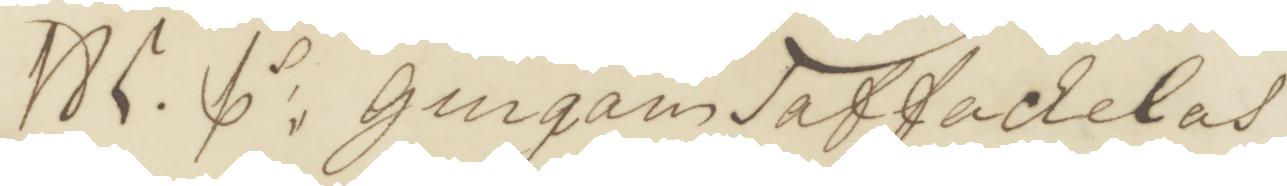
185. p„s gingam Taffachelas
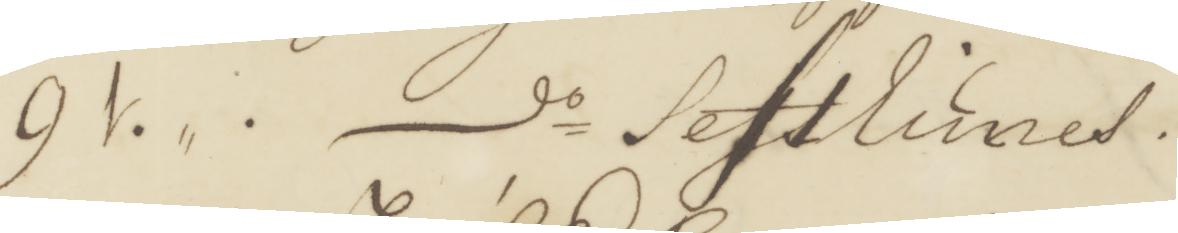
91.„. _=o sesthienes.
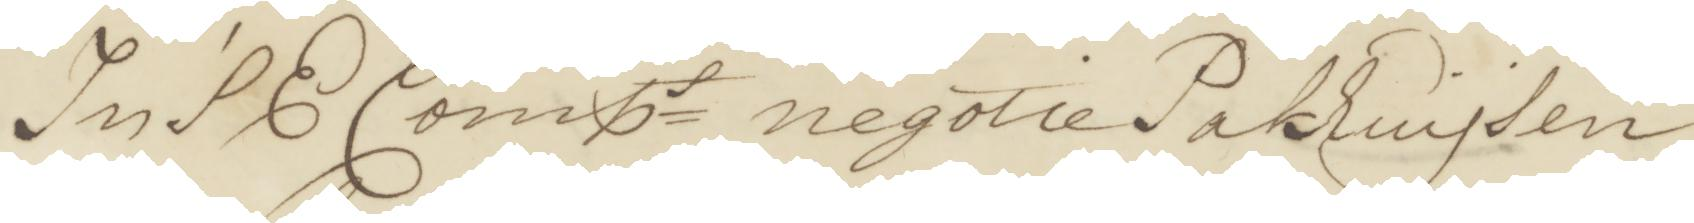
In 's E Comp=s negotie Pakhuijsen
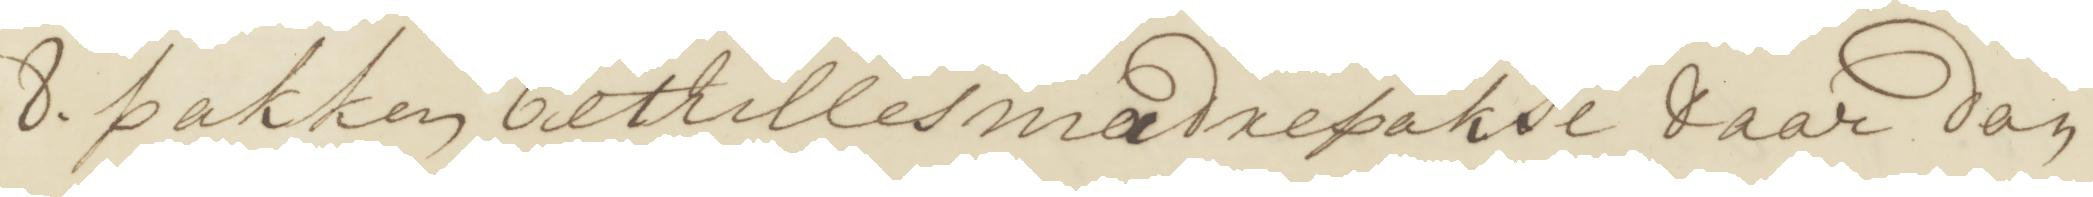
8. pakken bethilles madrepakse daar dan
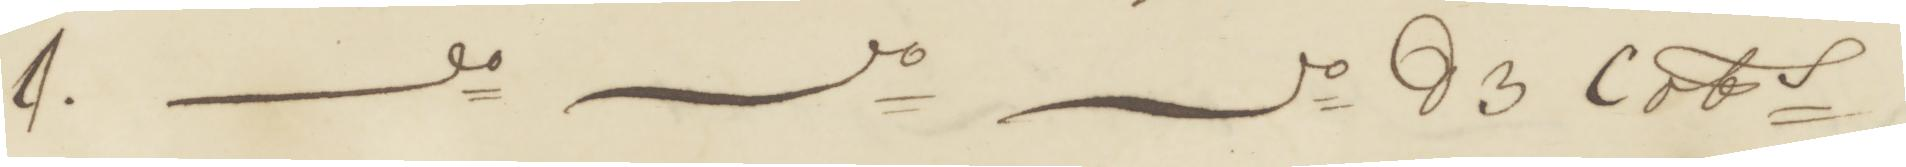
4. _=o _=o _=o d3 Cob=s
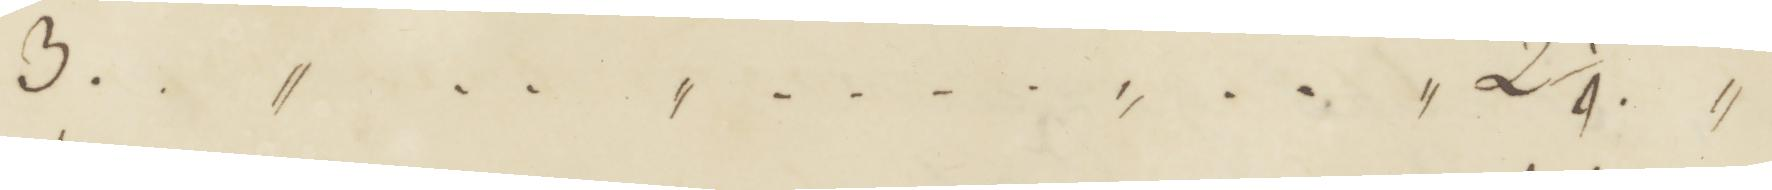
3. . „ . . „ . . . . „ . . „ 2¼. „
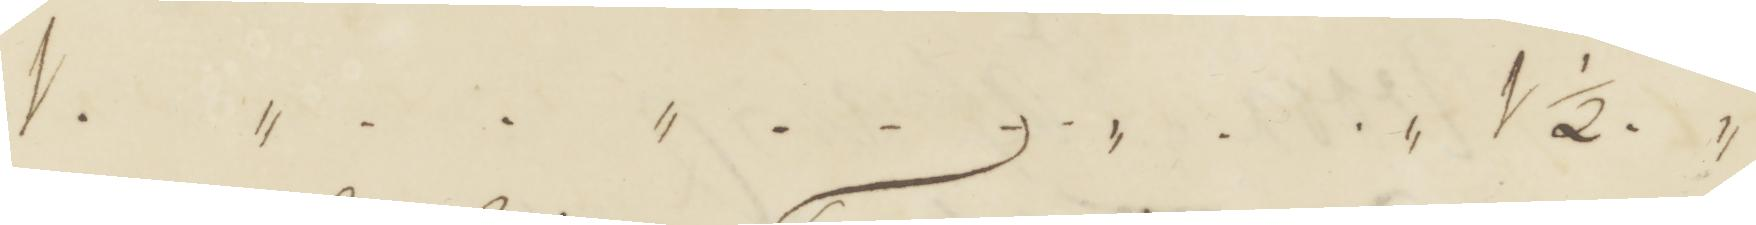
1. „ . . „ . . . . „ . . „ 1½. „
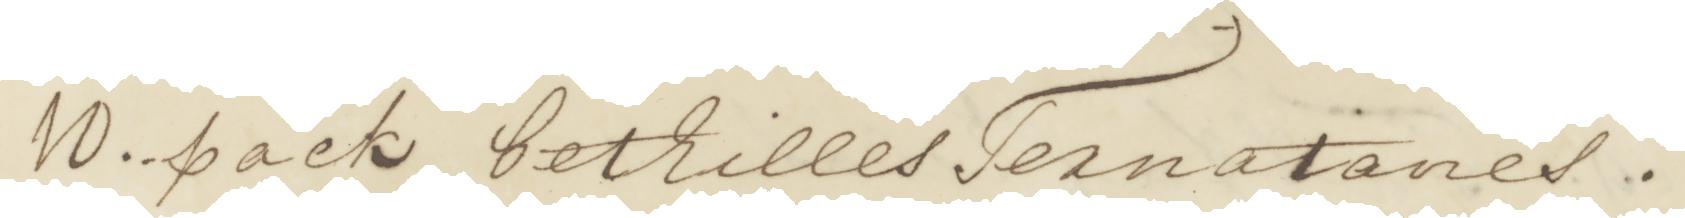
10. pack, bethilles Ternatanes
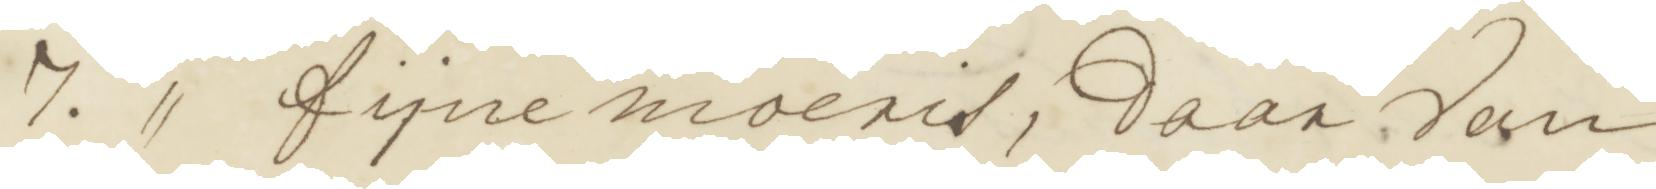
7. „ fijne moeris, daar van
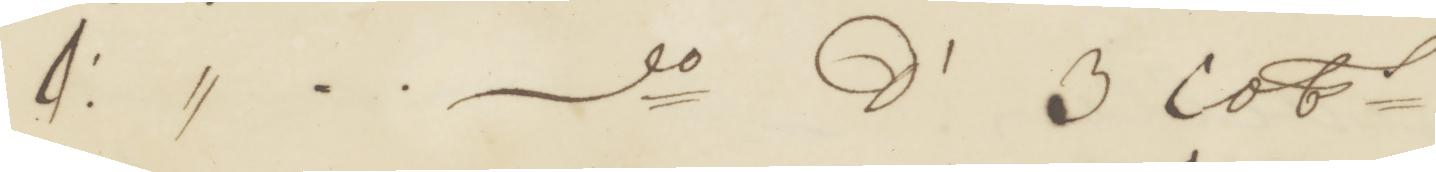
4: „ . . _=o d' 3 cob=s
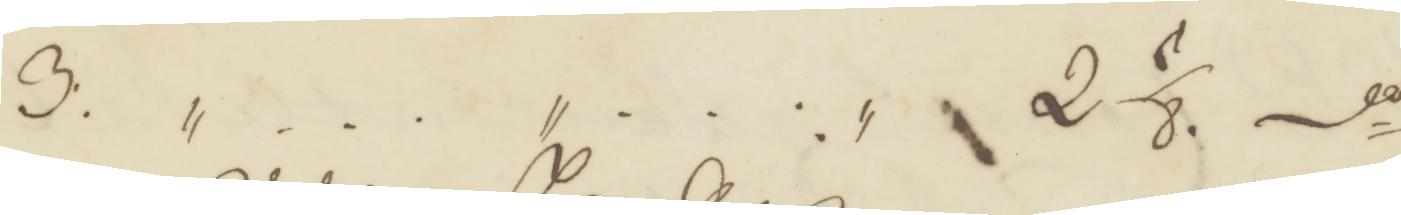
3: „ . . . „ . . : „ 2 5/8. _=o
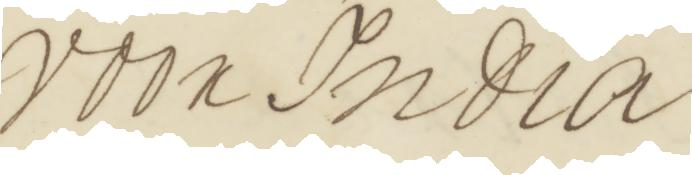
voor India
